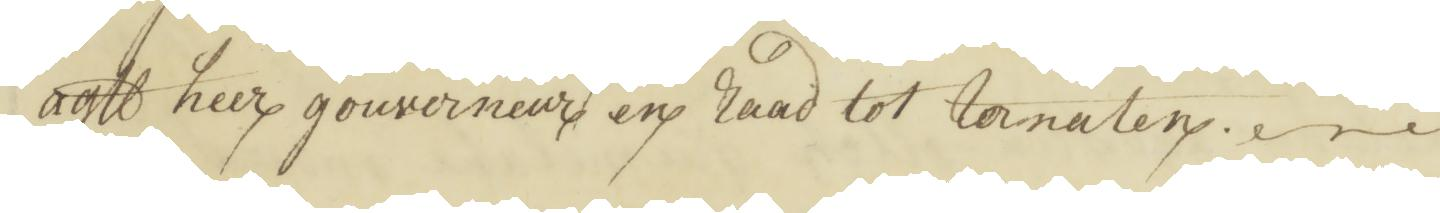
agtb heer gouverneur en raad tot ternaten.
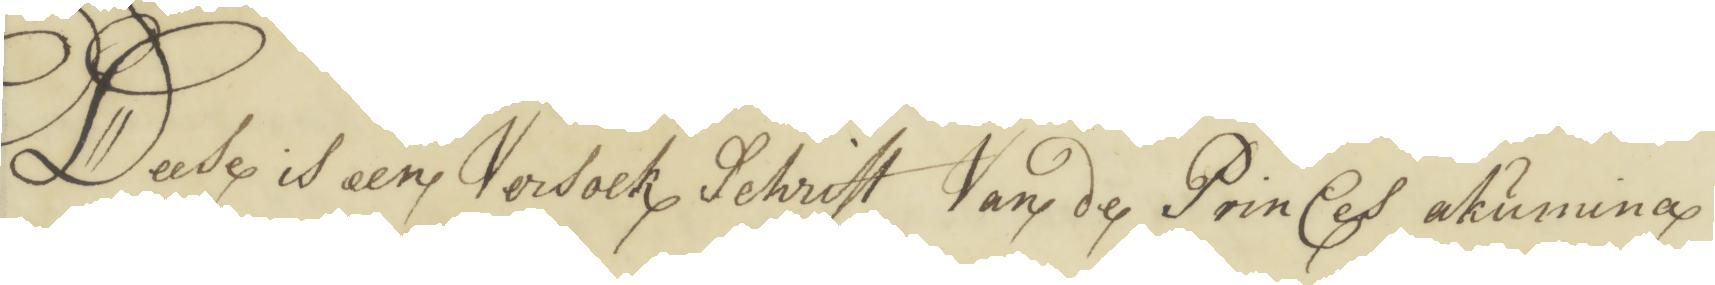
Deese is een versoek schrift van de Princes akumina
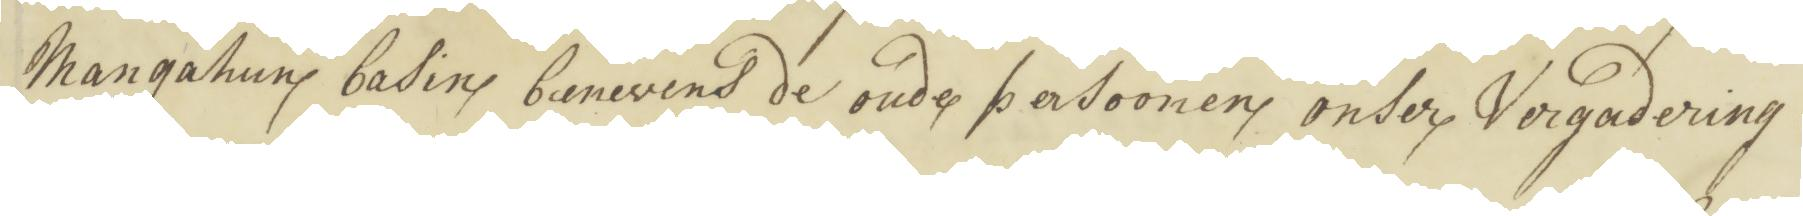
mangahun basin benevens de oude persoonen onser vergadering
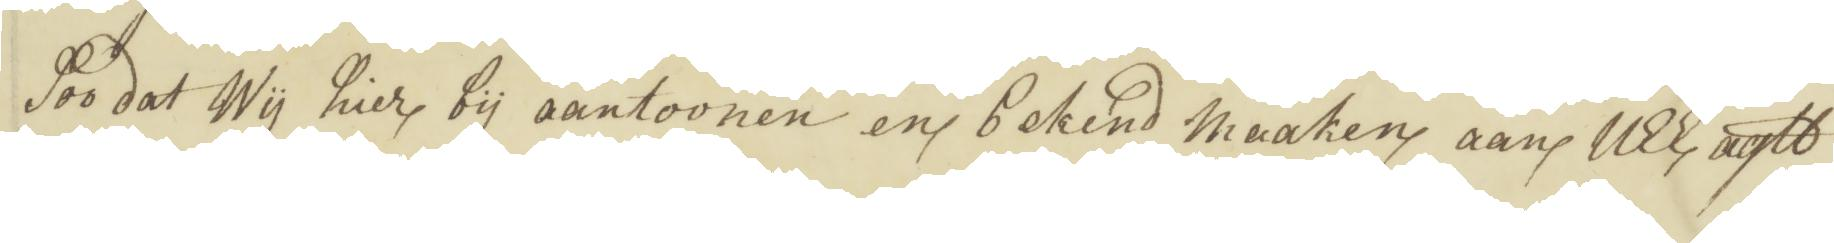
soo dat wij hier bij aantoonen en bekend maaken aan UEE agtb
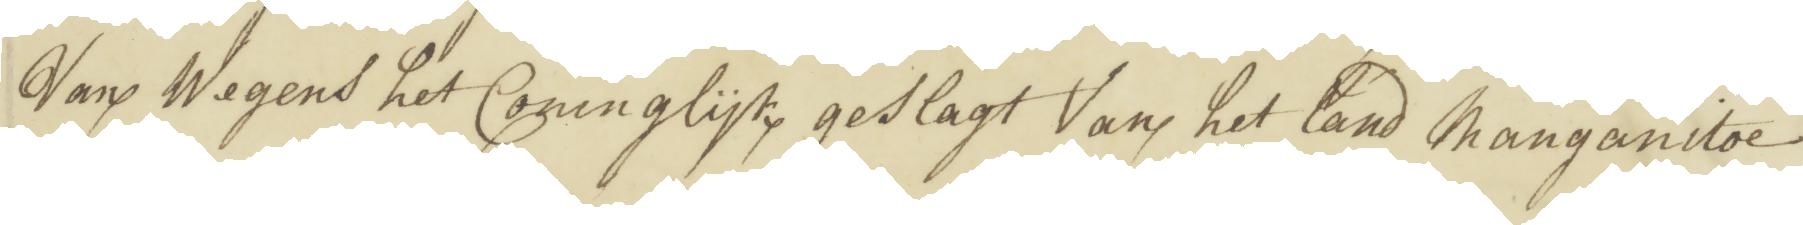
van wegens het Coninglijk geslagt van het land manganitoe
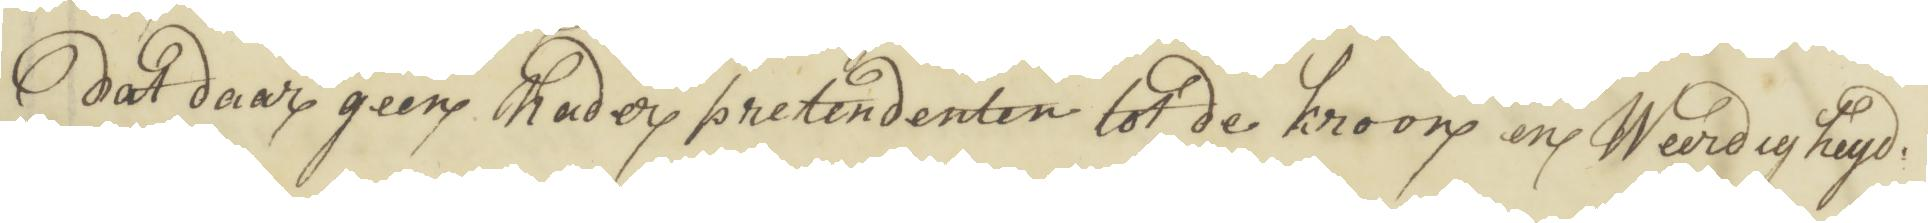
dat daar geen nader pretendenten tot de kroon en weerdigheyd
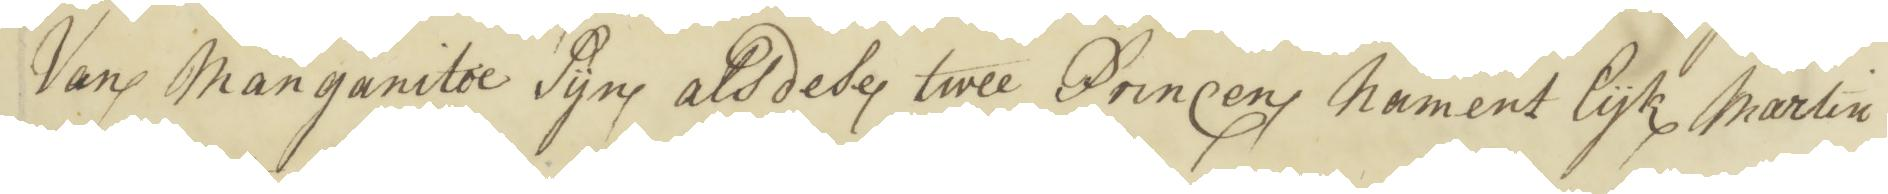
van manganitoe sijn, als dese twee Princen, nament lijk martin
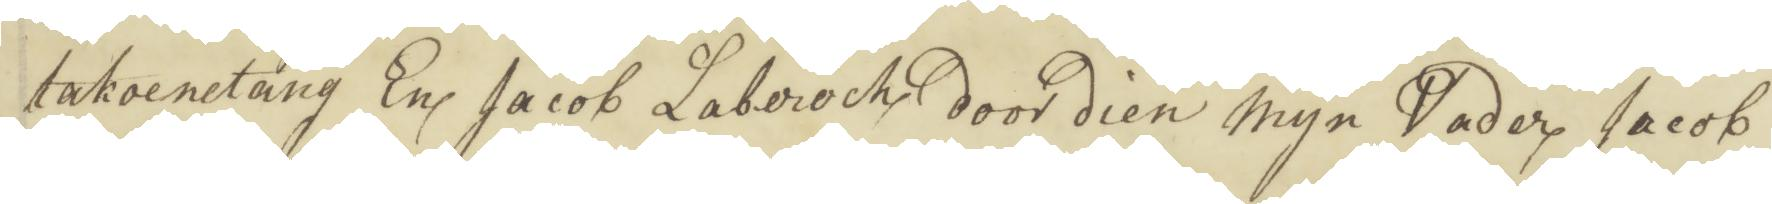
takoenetang En Jacob Laberock door dien myn vader Jacob
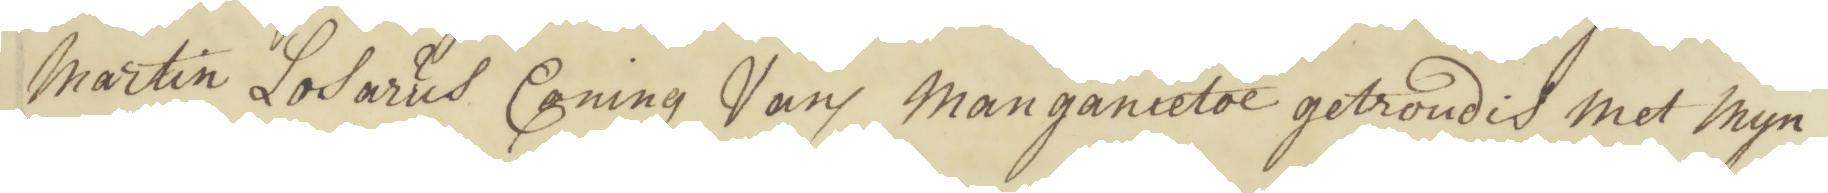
martin Losarus Coning van manganietoe getroud is met mijn
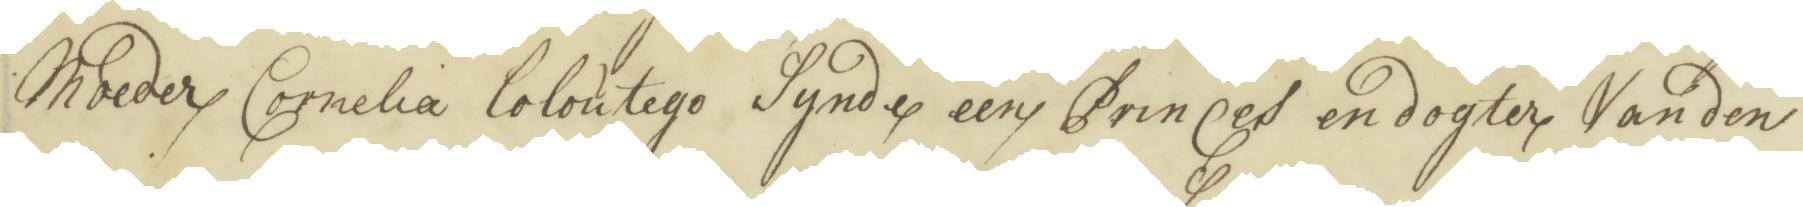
moeder Cornelia loloutego synde een Princes en dogter van den
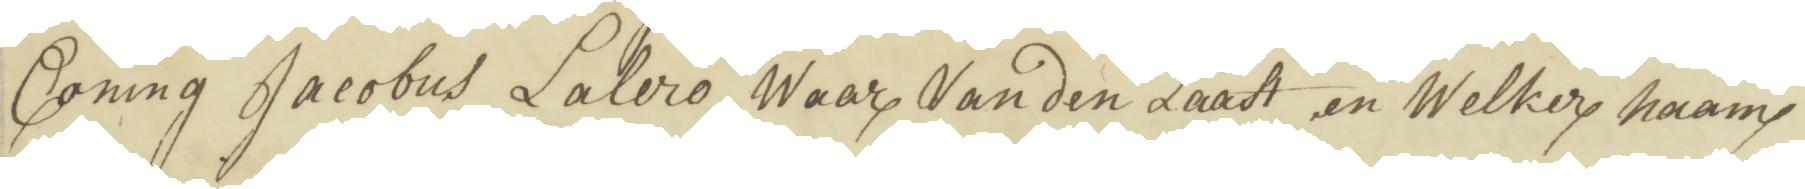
Coning Jacobus Lalero waar van den Laast en welker naam
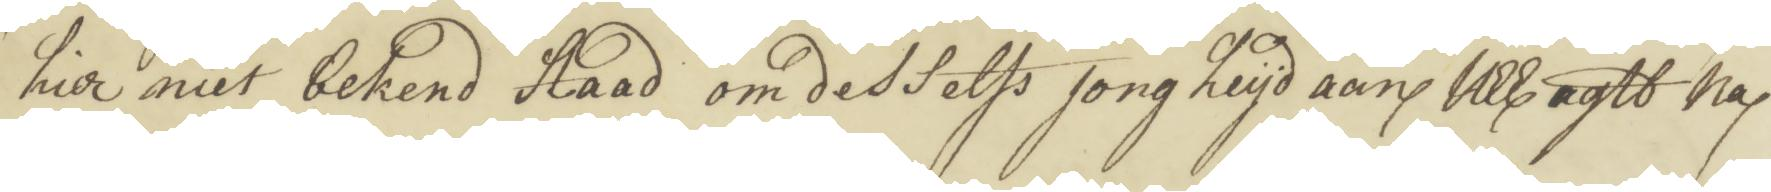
hier niet bekend staad om desselfs jongheijd aan UEE agtb na
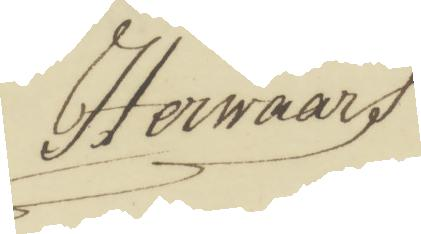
Herwaars
